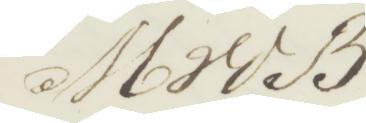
M vd B
